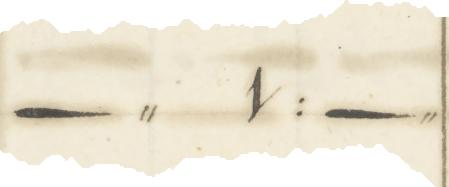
— „ 1: —„
